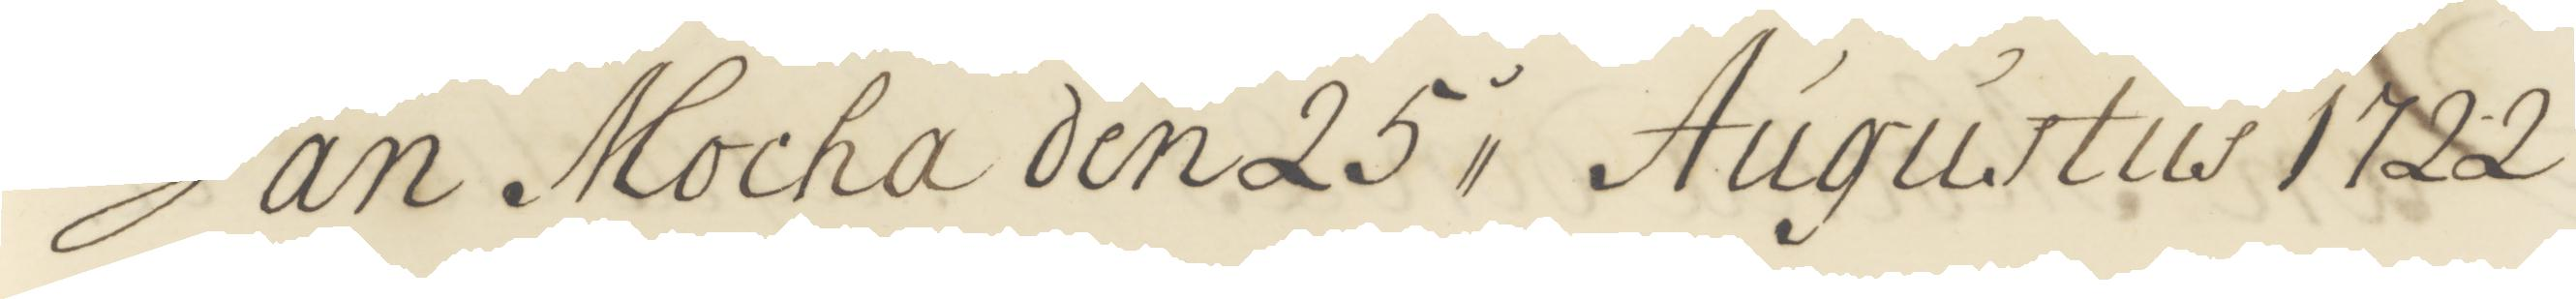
Van Mocha den 25„' Augustus 1722
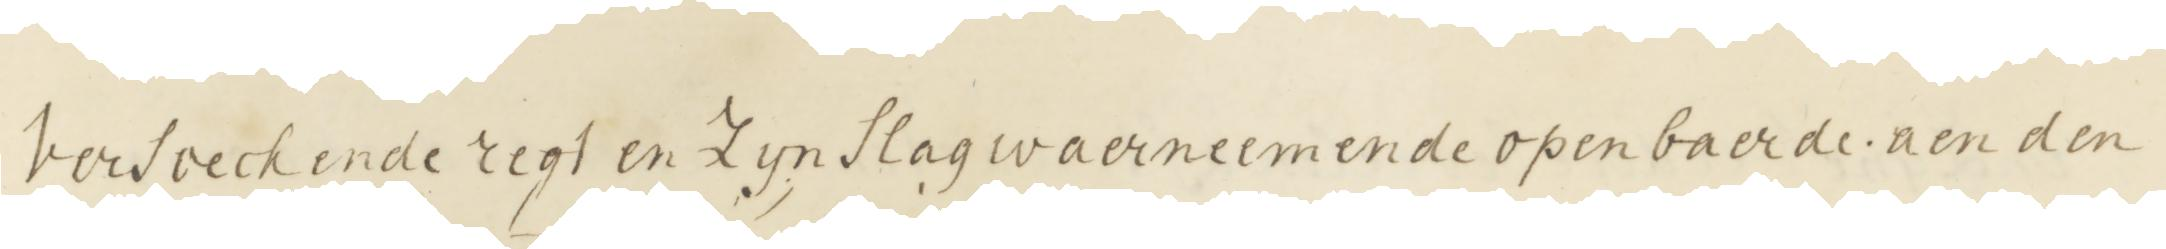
versoeckende regt en zyn slag waerneemende openbaerde aen den
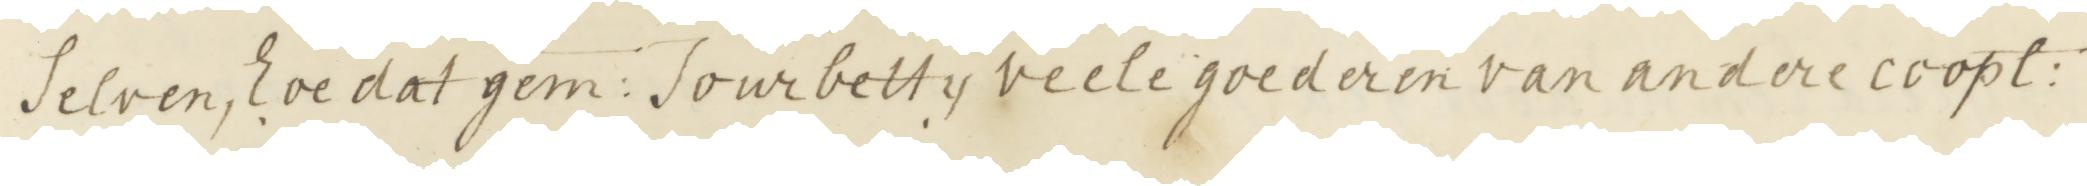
selven, hoe dat gem: Tourbettij veele goederen van andere coopl:
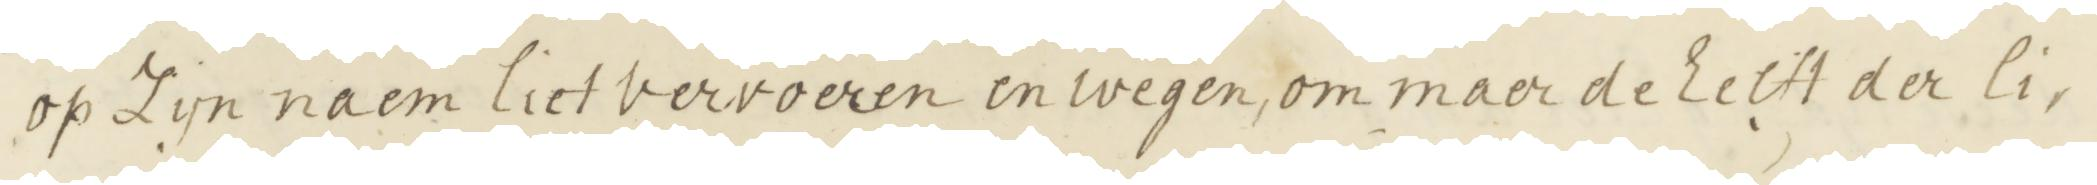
op zijn naem liet vervoeren en wegen, om maer de helft der li„
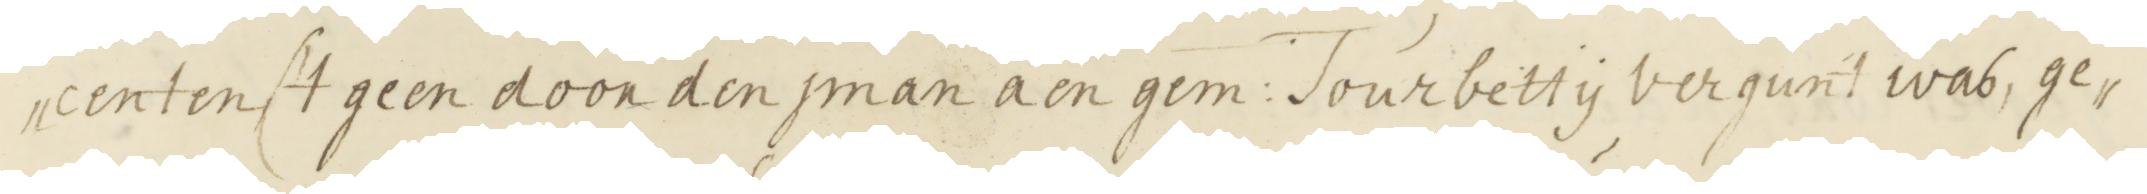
„centen (’t geen door den jman aen gem: Tourbettij vergunt was, ge„
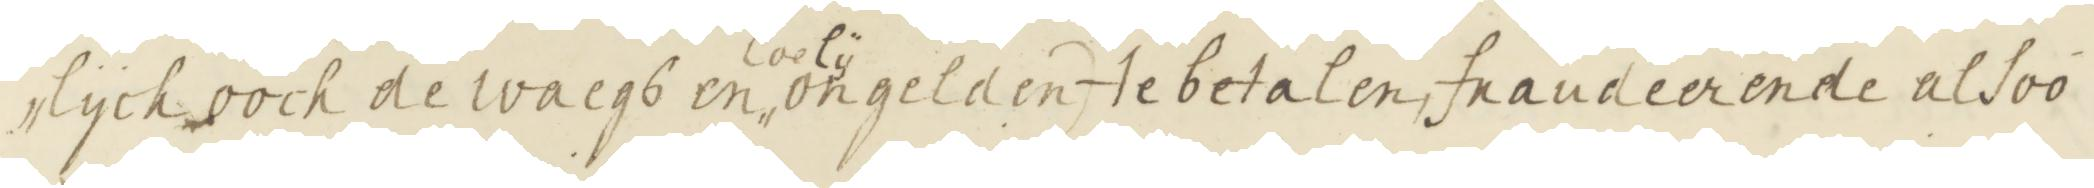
„lijck oock de waegs en „ongelden) te betalen, fraudeerende alsoo
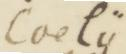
Coelij
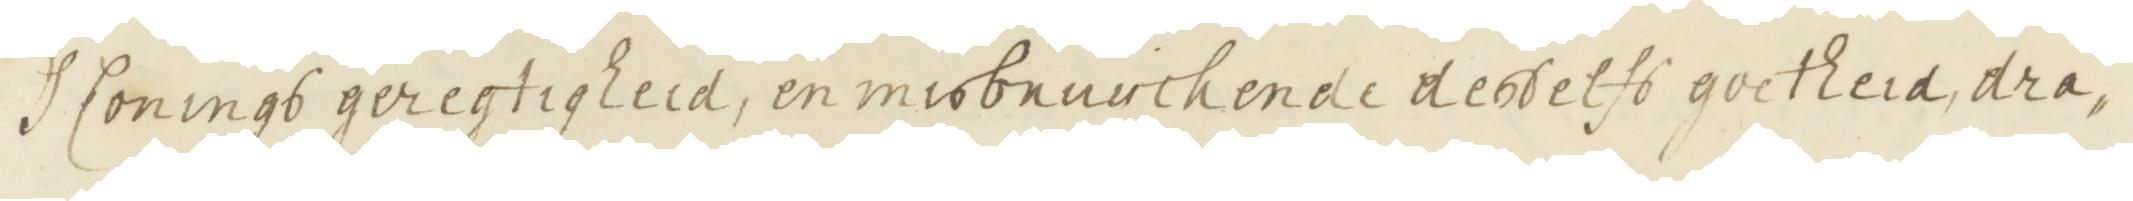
's Conings geregtigheid, en misbruijck ende desselfs goetheid, dra„
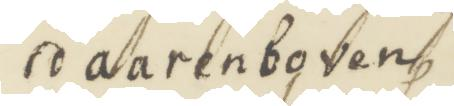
daarenboven
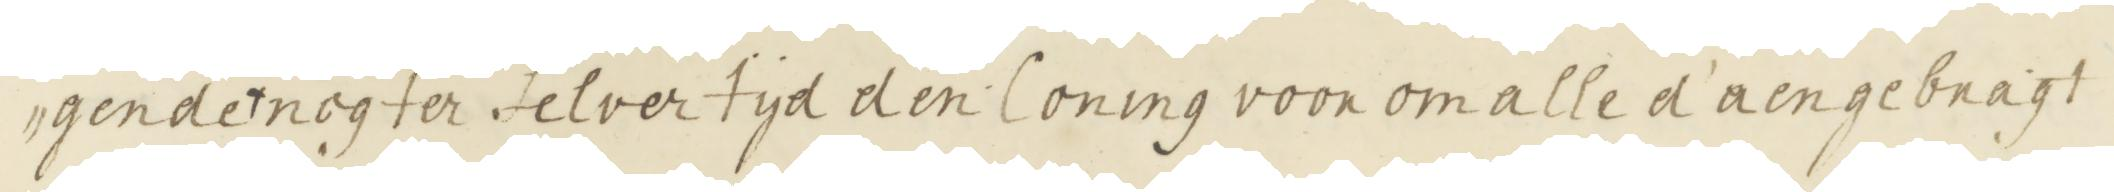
„gende ^ nog ter selver tijd den Coning voor om alle d'aengebragt
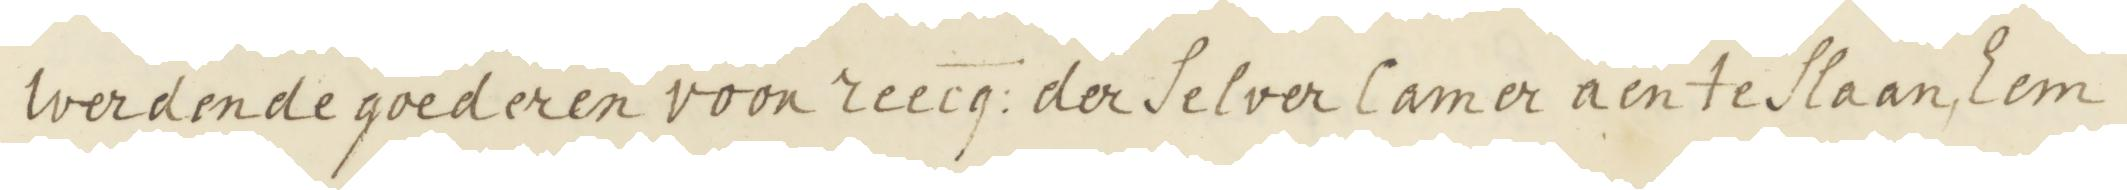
werdende goederen voor reecq: der selver Camer aen te slaan, hem
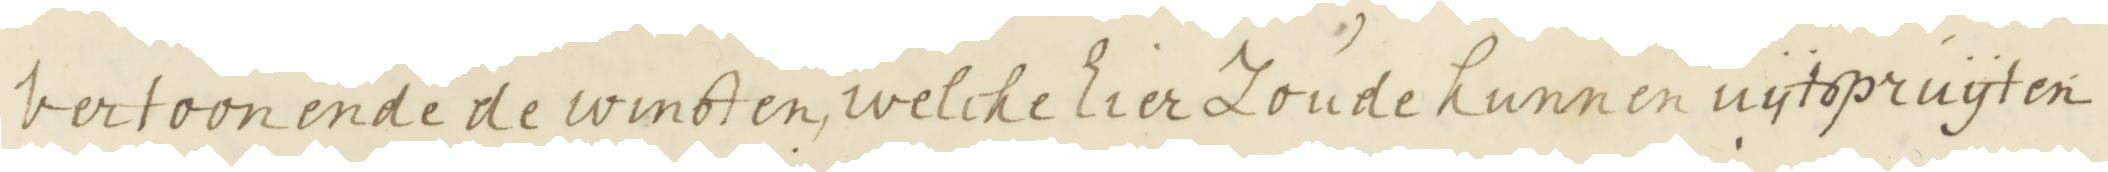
vertoonende de winsten, welcke hier zoude kunnen uijtspruijten
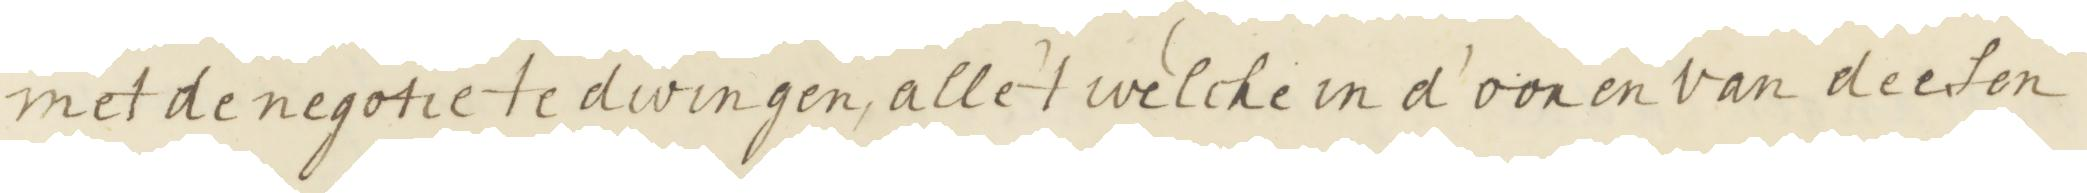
met de negotie te dwingen, alle ’t welcke in d'ooren van deesen
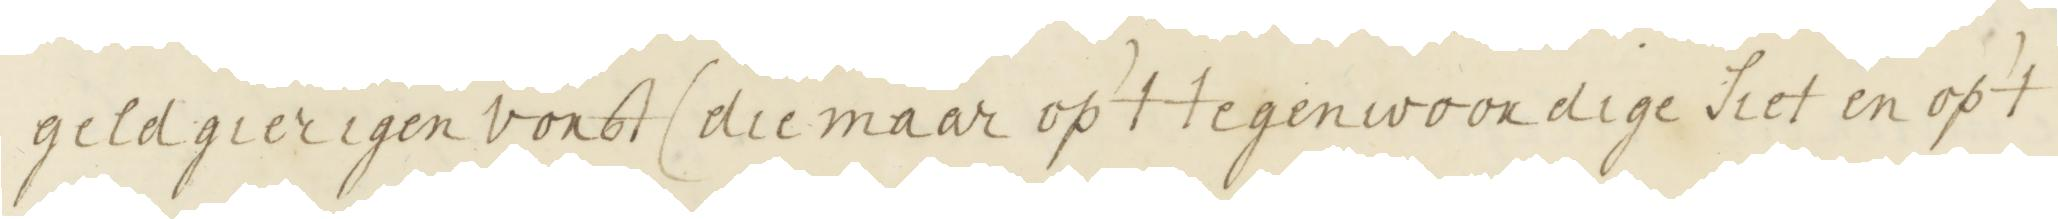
geldgierigen vorst (die maar op ’t tegenwoordige siet en op’t
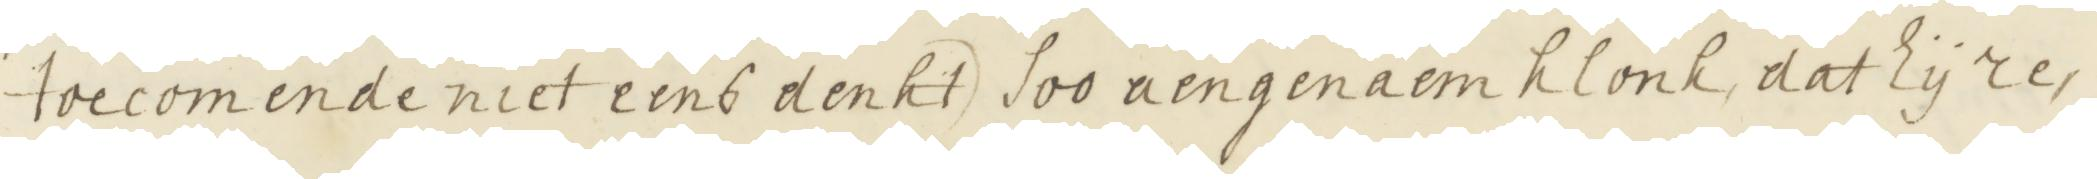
toecomende niet eens denkt) soo aengenaem klonk, dat hij re„
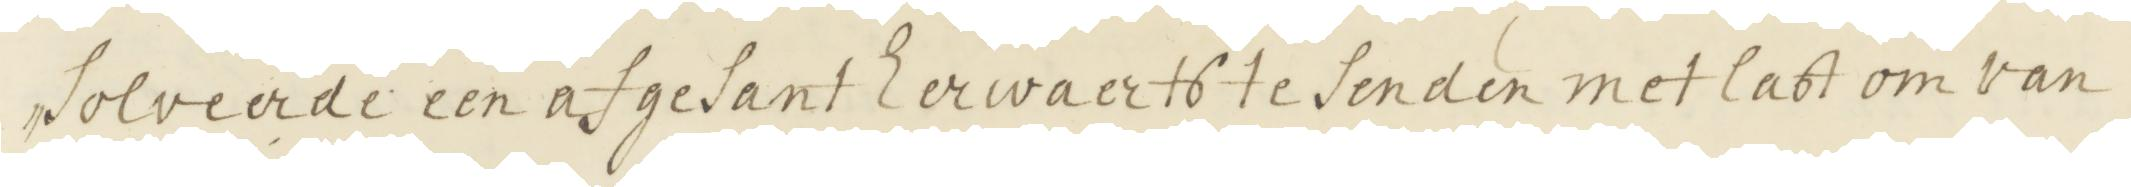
„solveerde een afgesant herwaerts te senden met last om van
